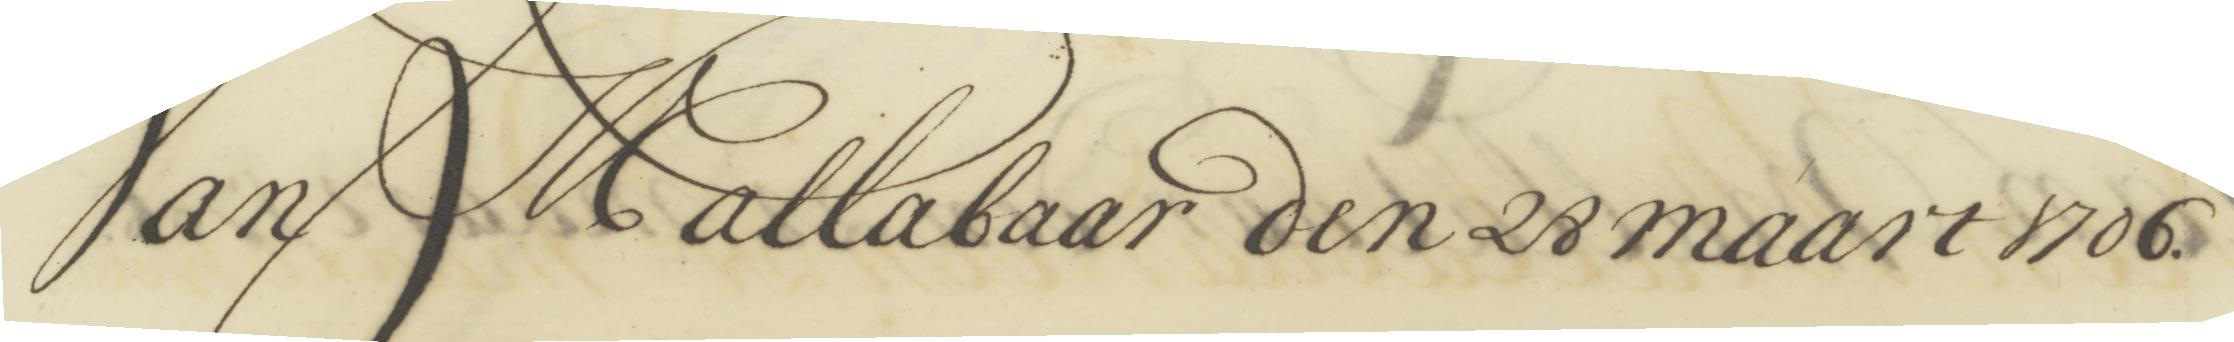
Van Mallabaar den 28 maart 1706.
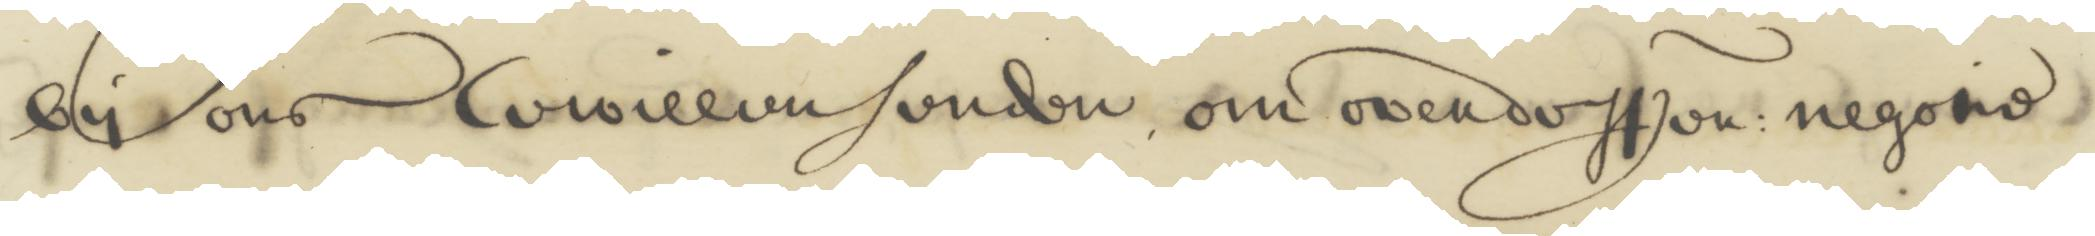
bij ons tewillen senden, om over de pper: negotie
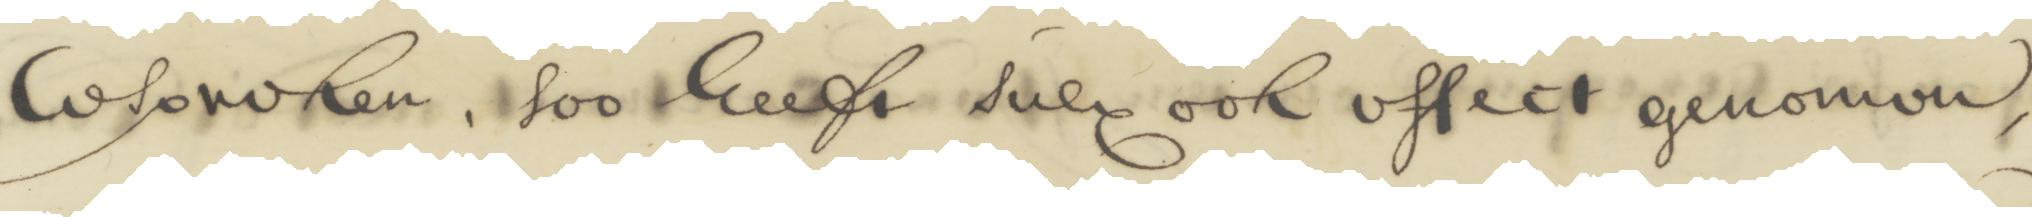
tespreken, soo heeft sulx ook effect genomen
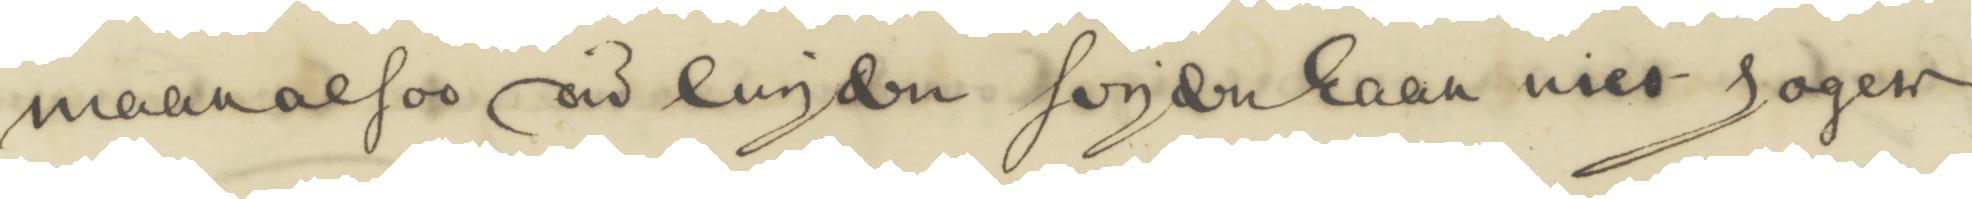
maar alsoo die luijden seijden haar niet hoger
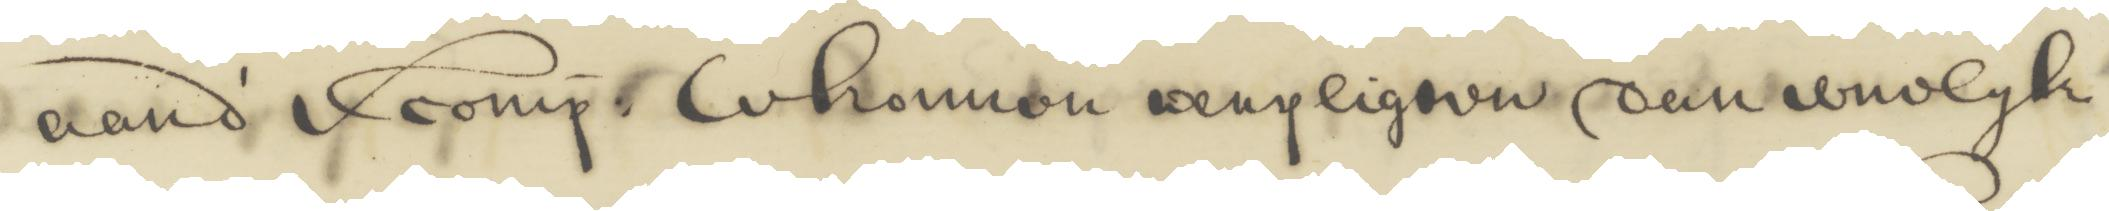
aan d’ E comp: te konnen verpligten dan eenelijk
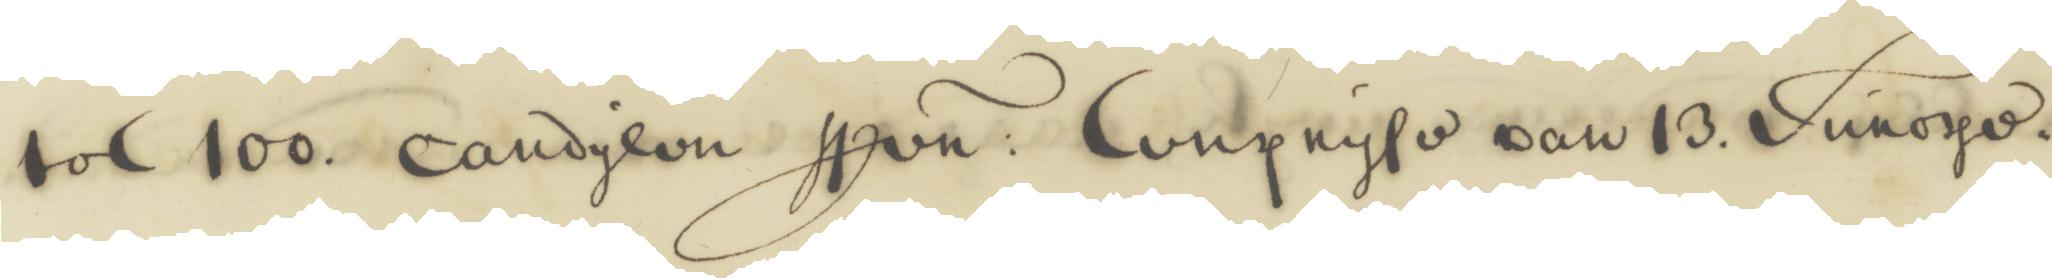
tot 100. candijlen pper: tenprijse van 13. Europe„
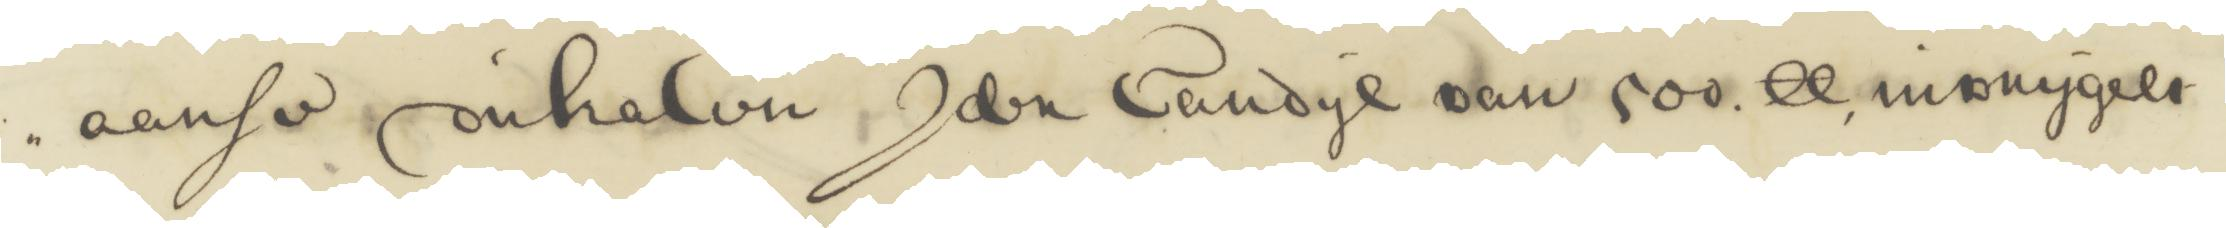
„aanse dukaten Jder Candijl van 500. lb, invrijgelt
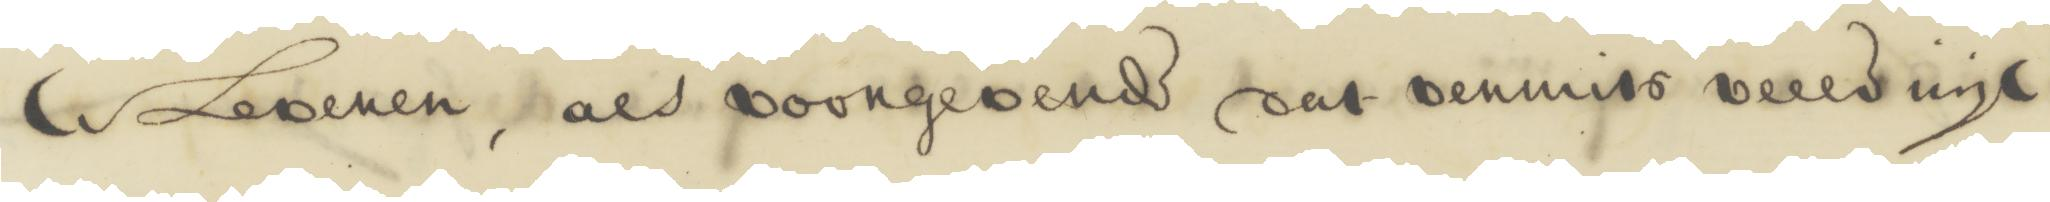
te leveren, als voorgevende dat vermits veele uijt
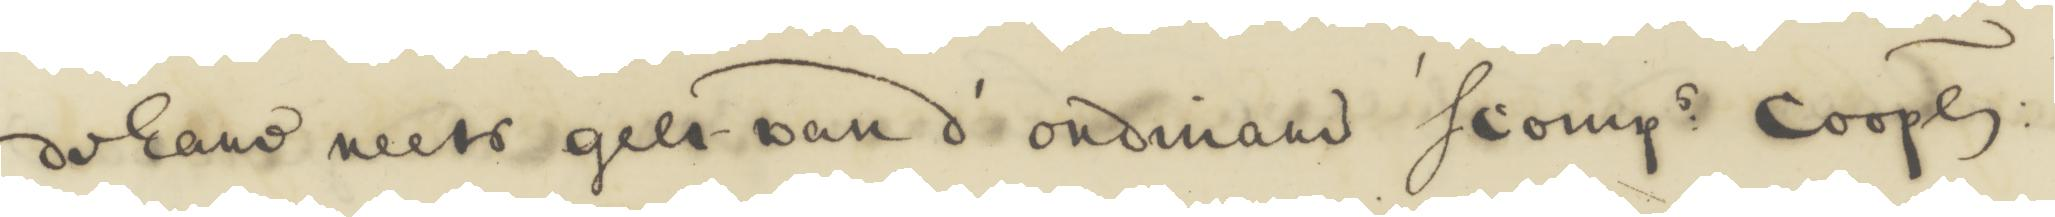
de hare reets gelt van d’ ordinare 'scomp:s coopl:
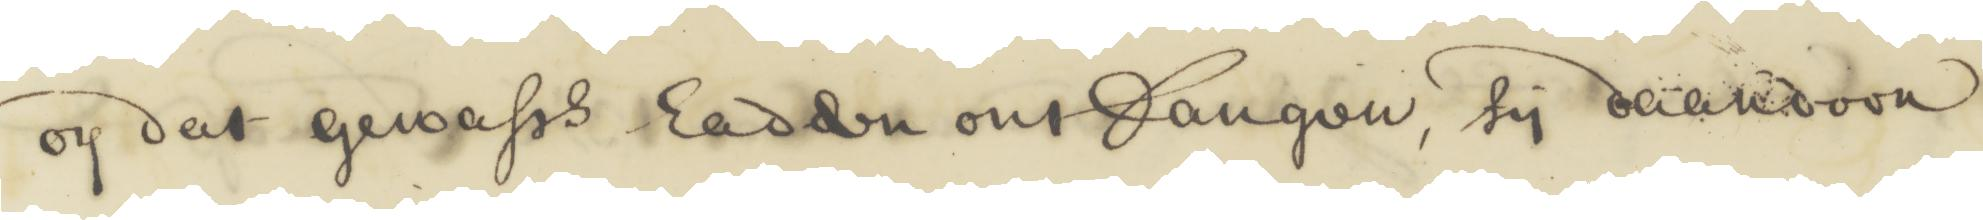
op dat gewasch hadden ontfangen, sij daardoor
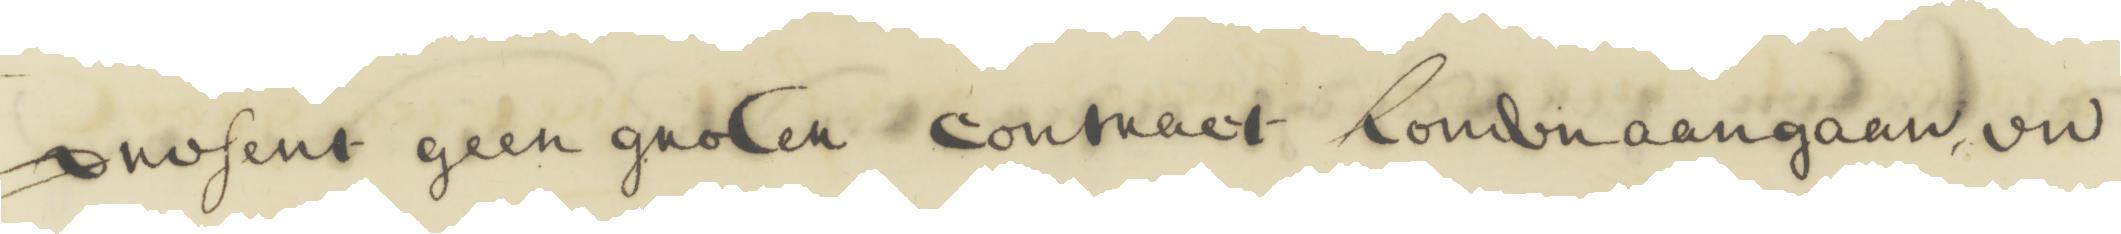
present geen groter contract konden aangaan, en
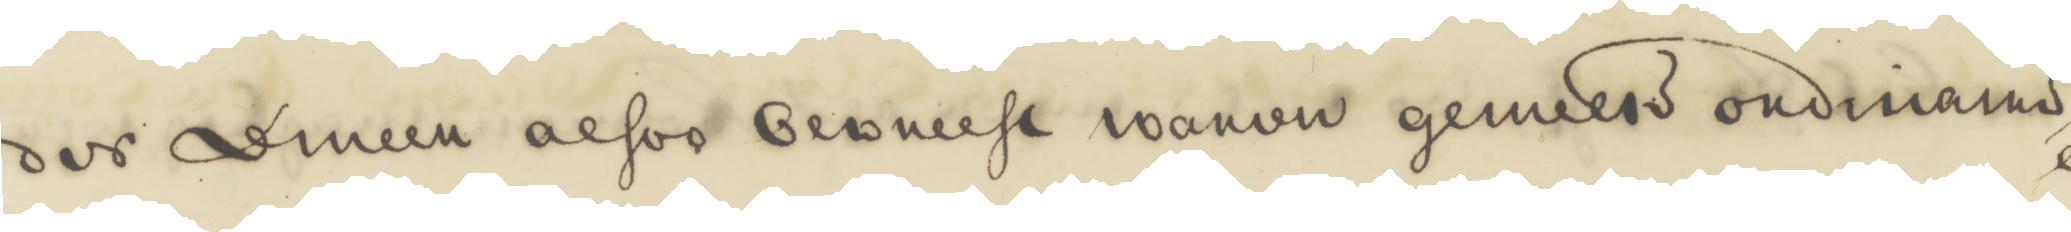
des temeer alsoo bevreest waren gemelte ordinaire
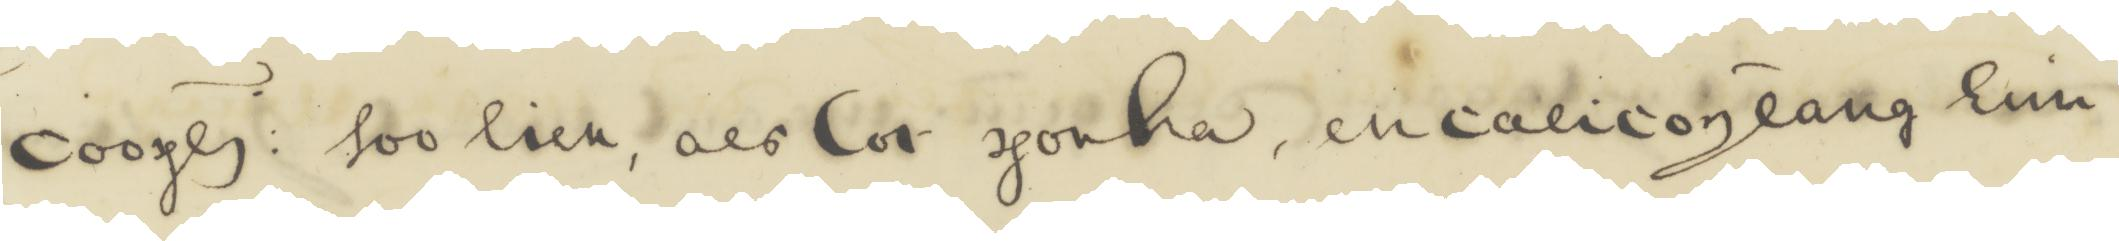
coopl: soo hier, als tot porka, en calicoijlang hun
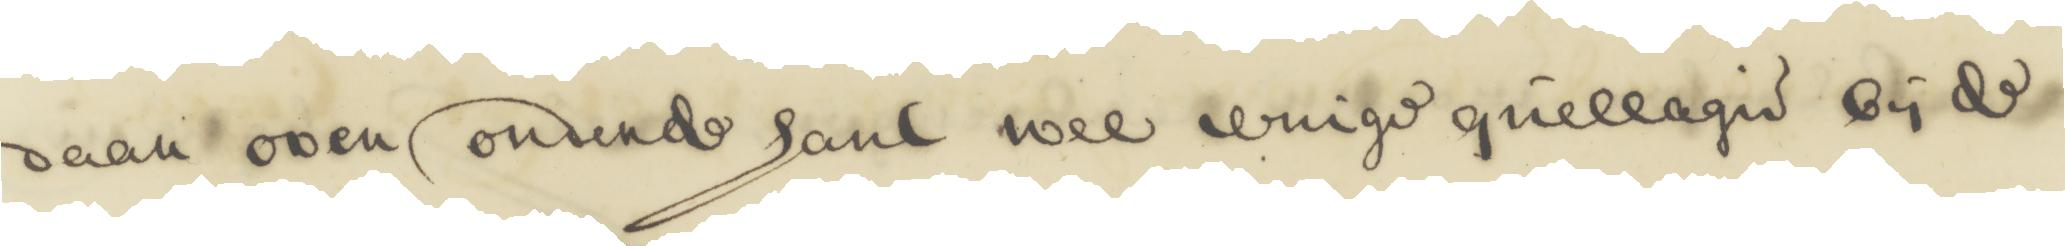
daar over onderde hant wel eenige quellagie bij de
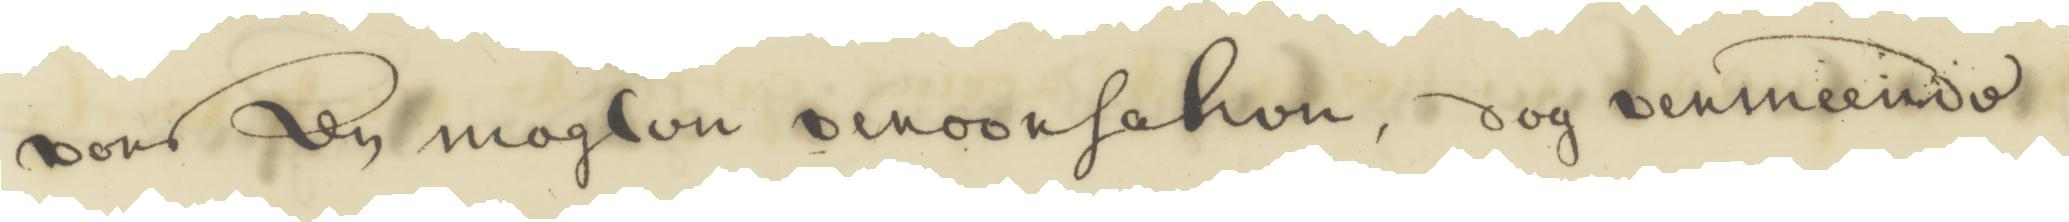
vorsten mogten veroorsaken, dog vermeende
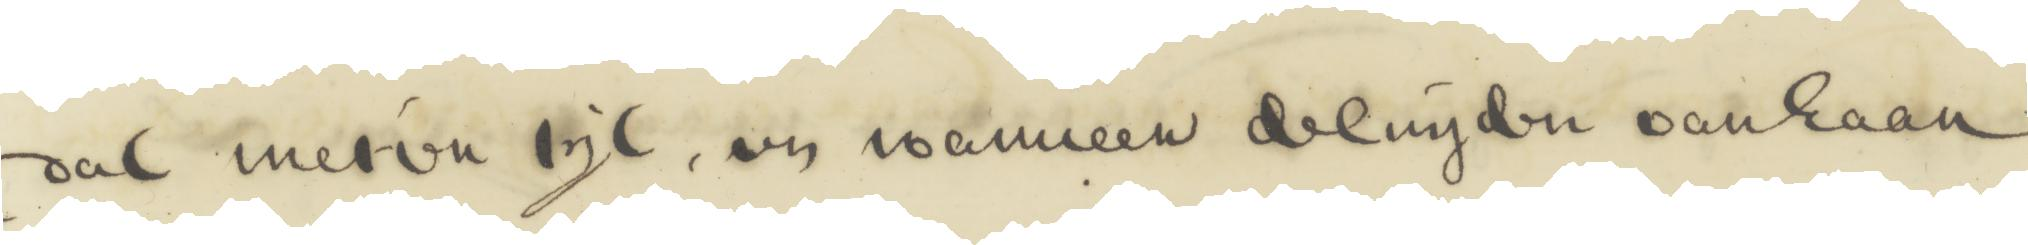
dat met 'er tijt, en wanneer deluijden van haar
